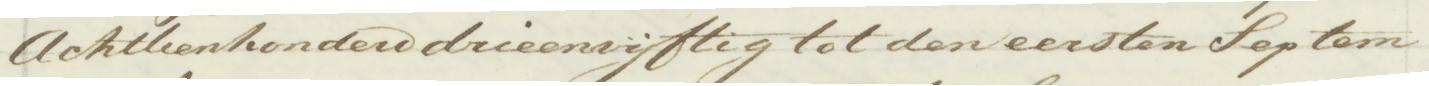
Achttienhonderd drieenvijftig tot den eersten Septem
